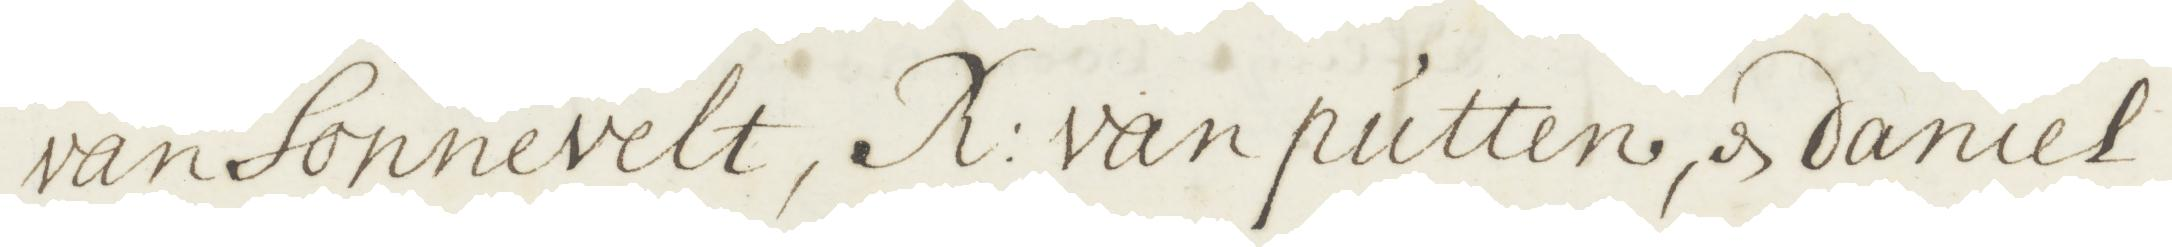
van Sonnevelt, R: van putten, en daniel
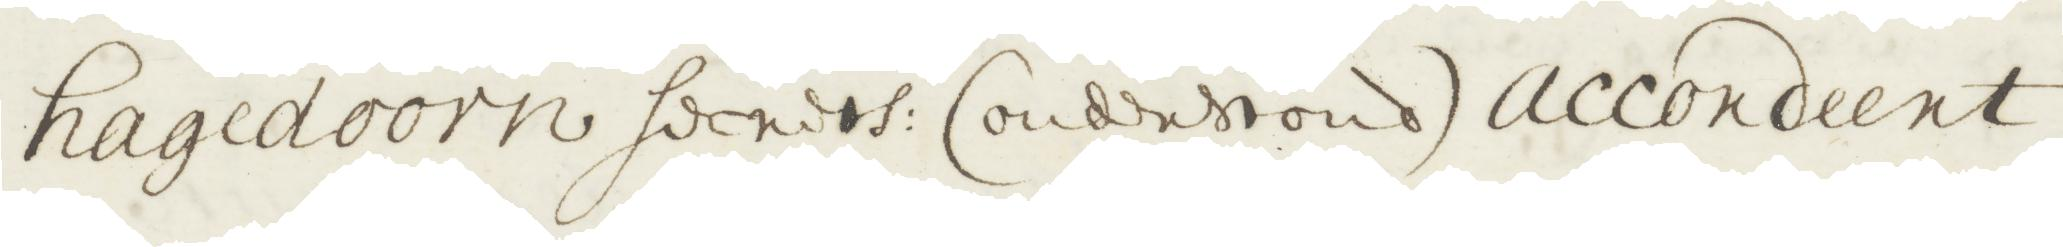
hagedoorn secrets: (onderstond) Accordeert
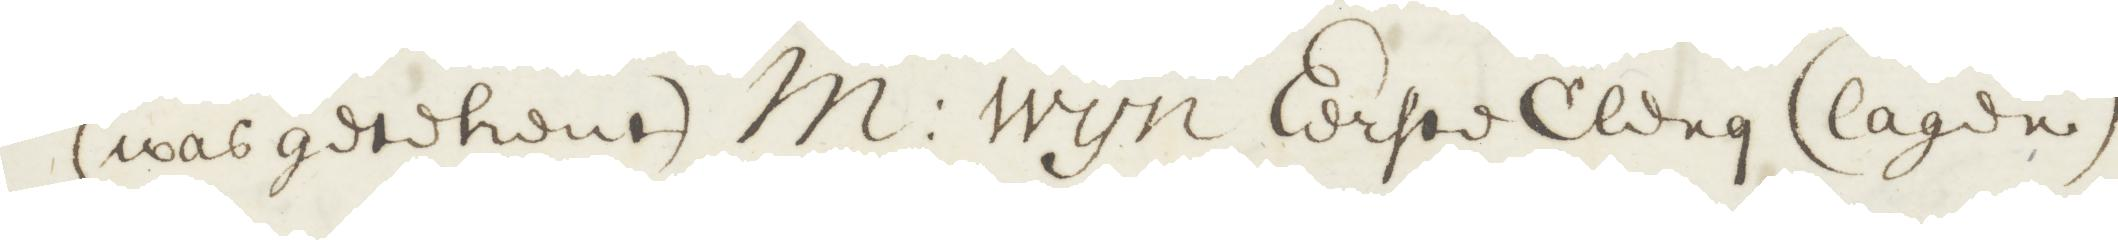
(was getekent) M: wijn Eerste clerq (lager)
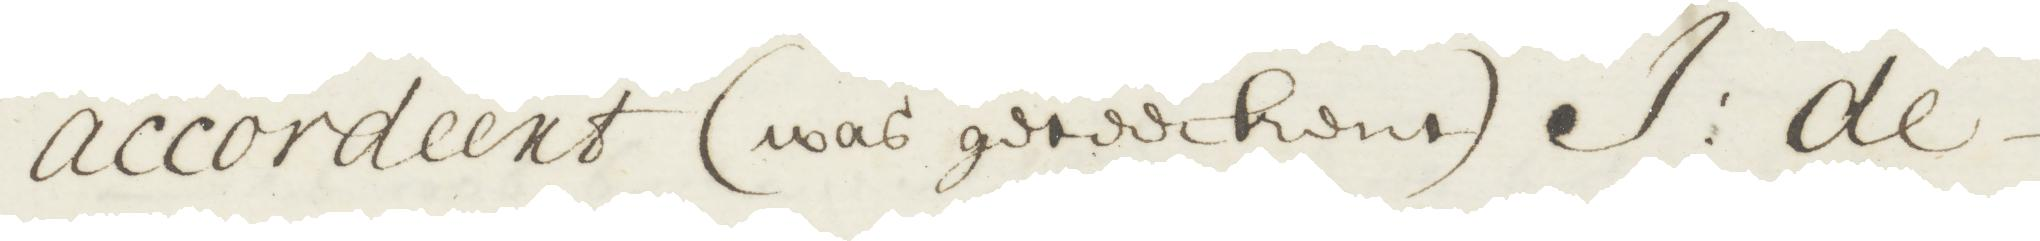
accordeert (was geteeckent) J: de
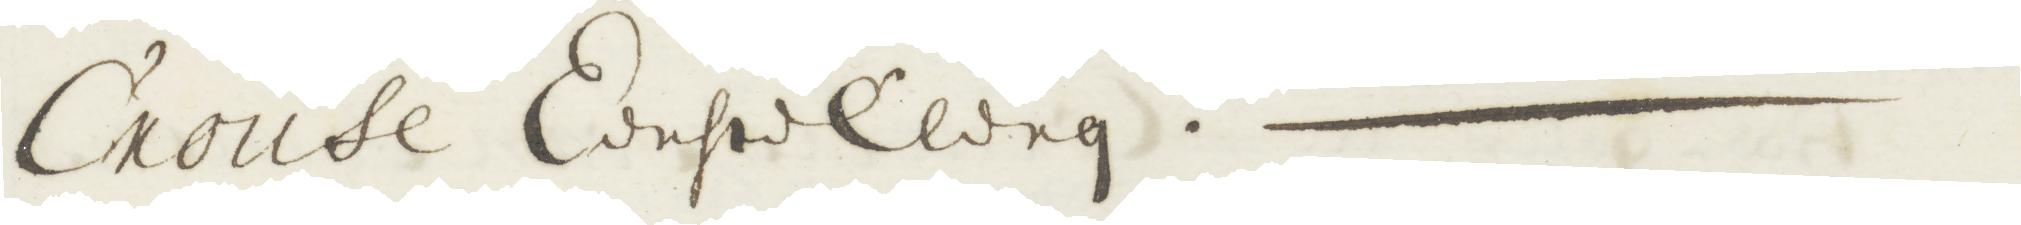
Crouse Eersteclerq .—
